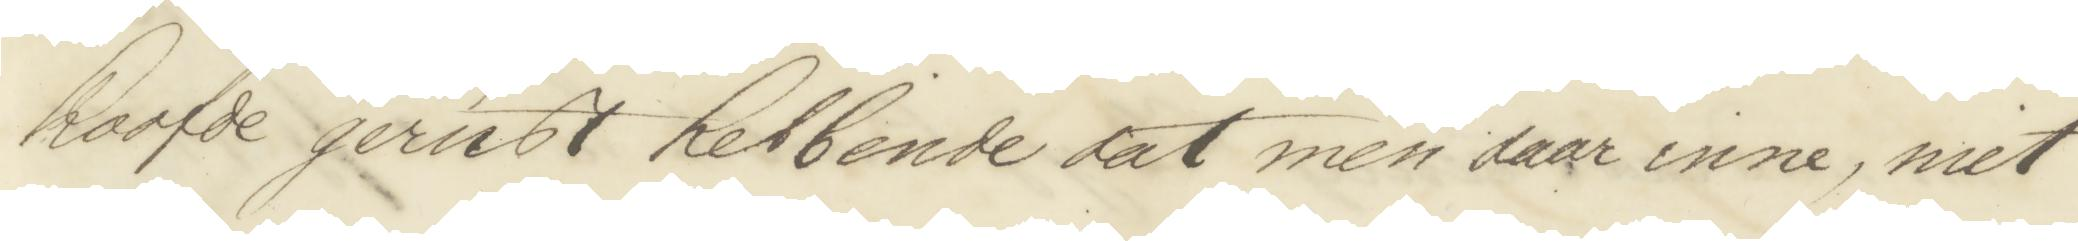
hoofde gerust hebbende dat men daar inne, niet
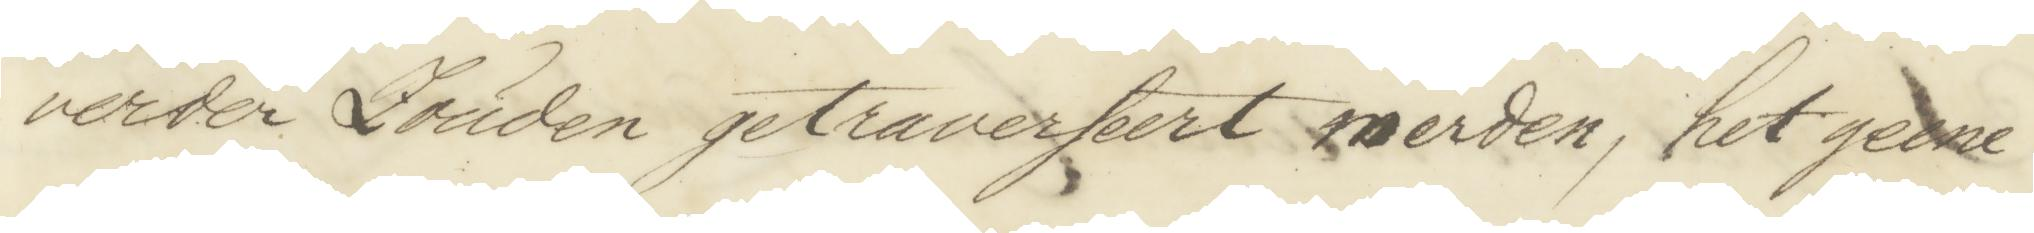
verder zouden getraverseert werden, het geene
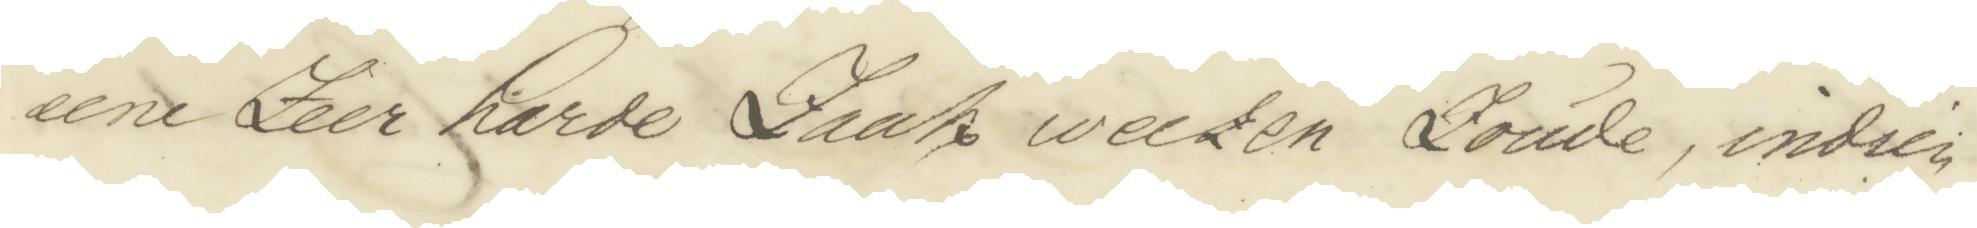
eene zeer harde zaak weezen zoude, indien
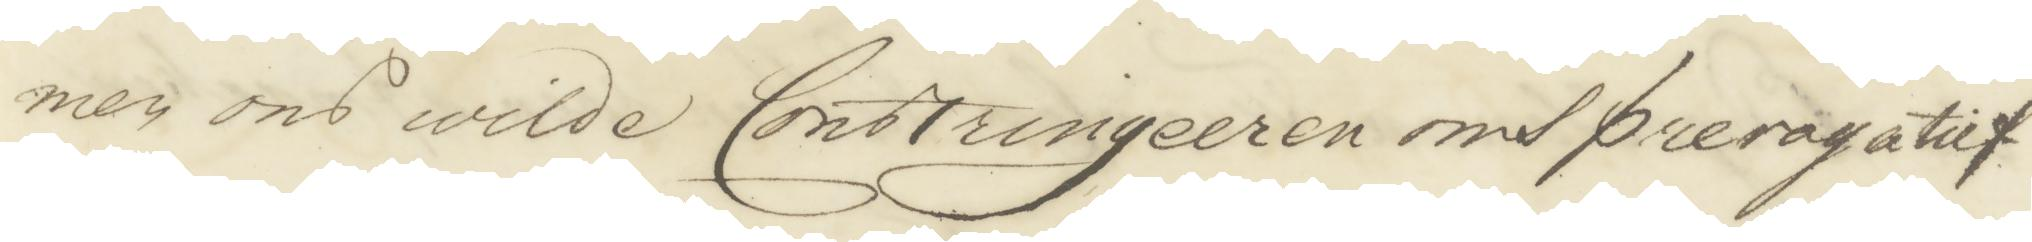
men ons wilde Constringeeren oms prevagatief
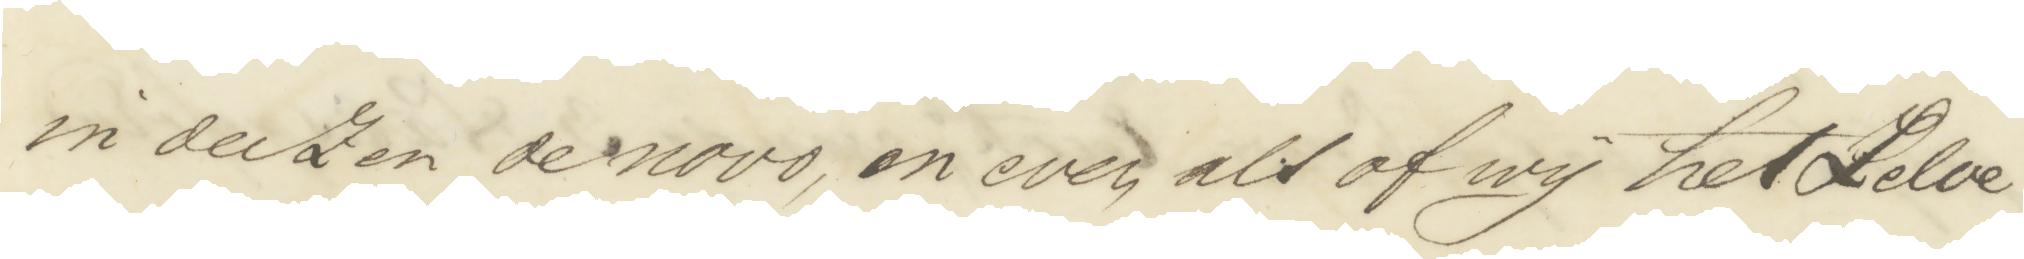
in deezen de novo, en even als of wij het Zelve
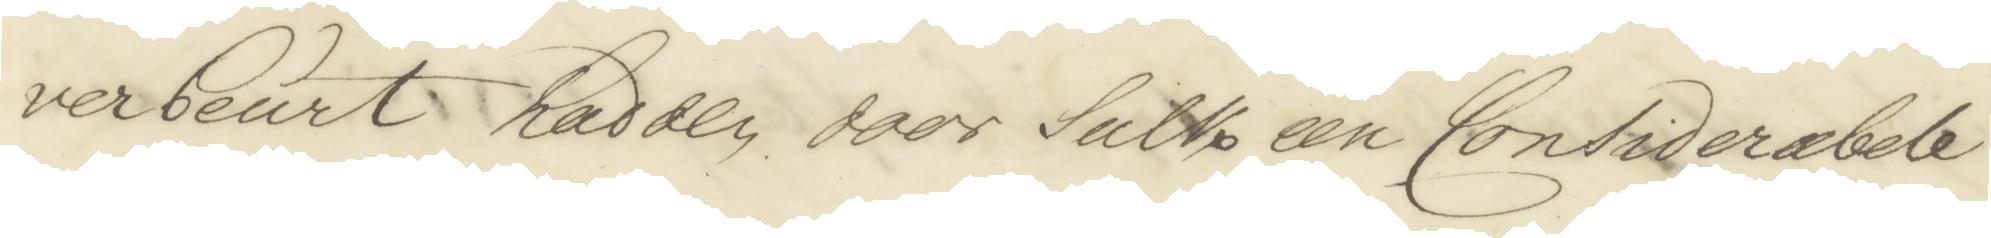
verbeurt hadden door sulk een Considerabele
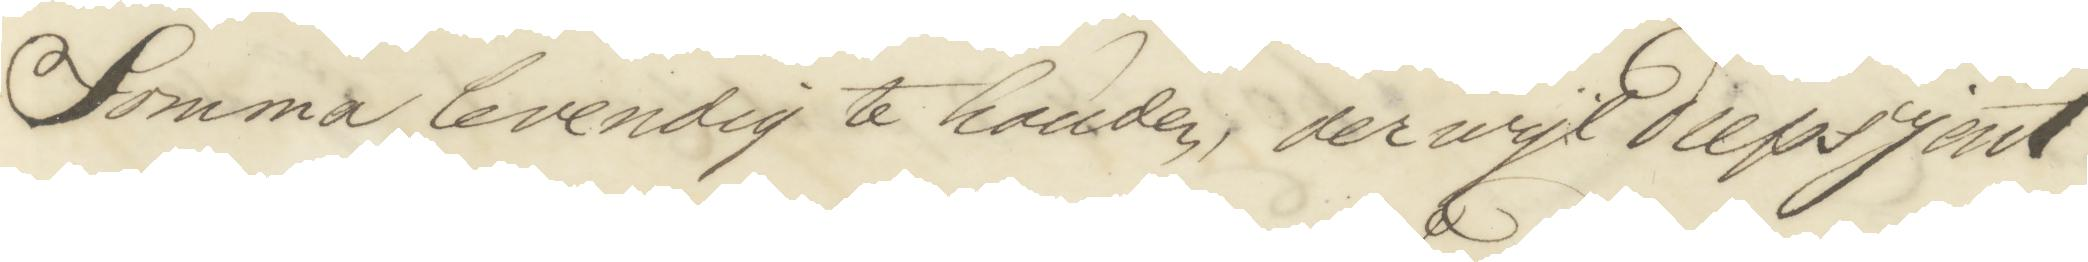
Somma levendig te houden, der wijl diepsjent
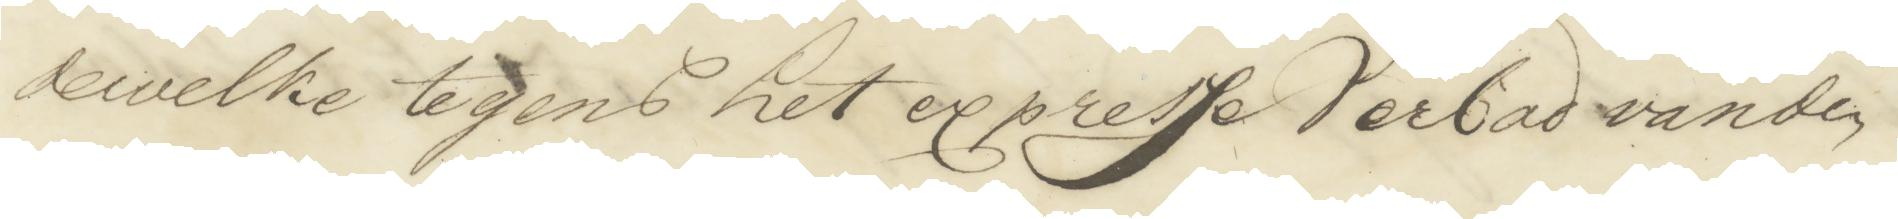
dewelke tegens het expresse verbad van den
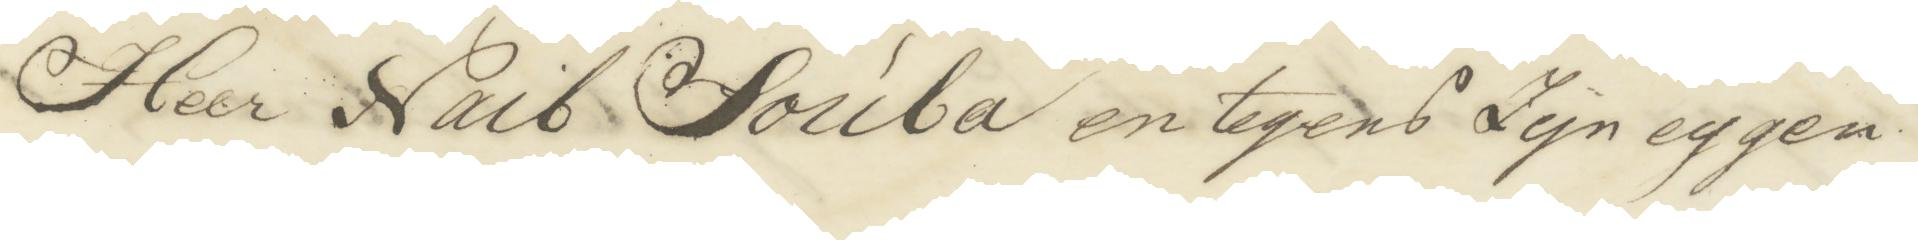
Heer Naib Souba en tegens zijn eggen.
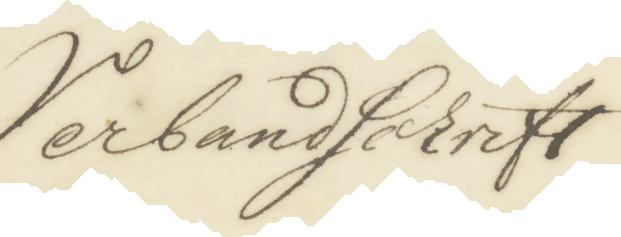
Verbandschrift
